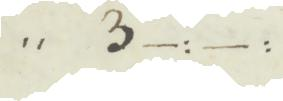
„ 3 —: —:
